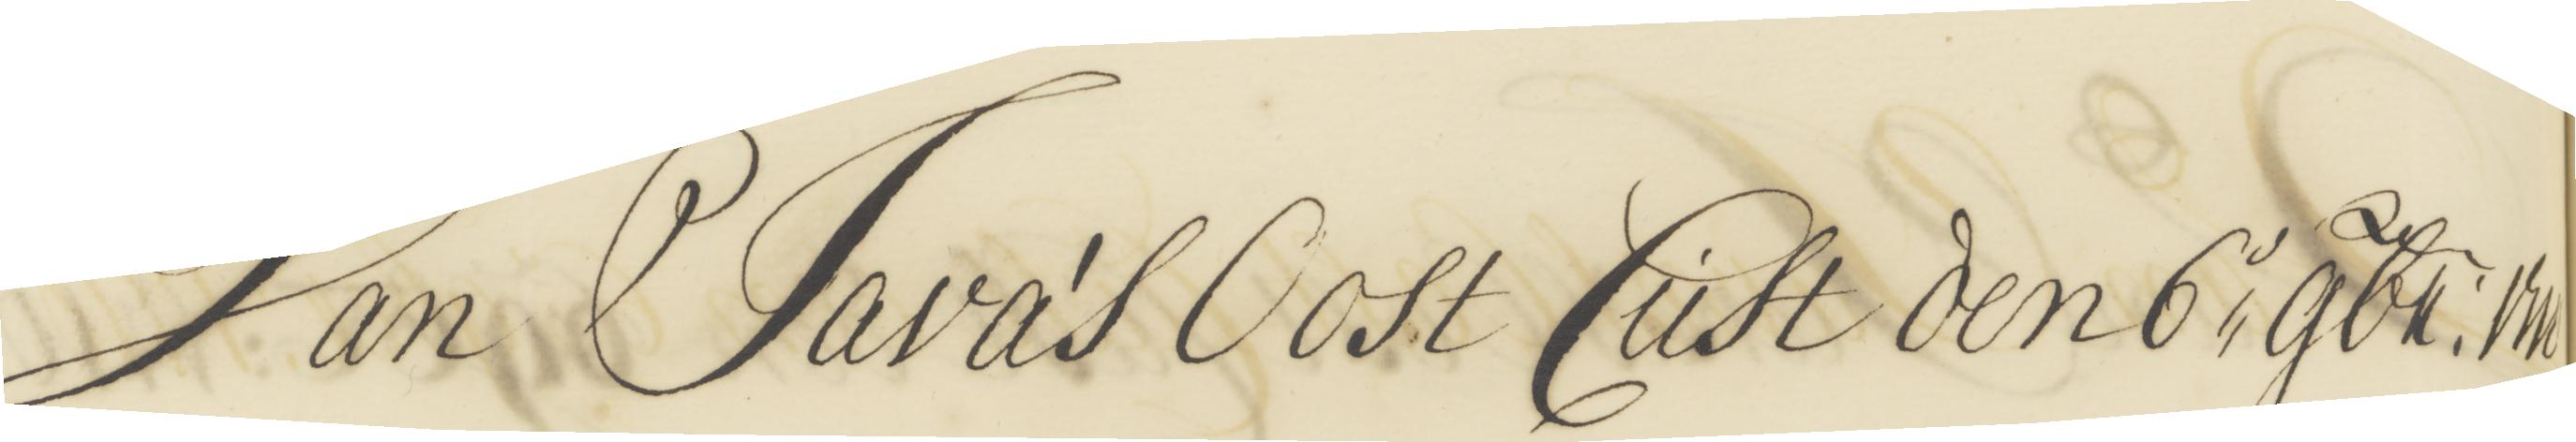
Van Iava's Oost Cust den 6„' 9br: 171
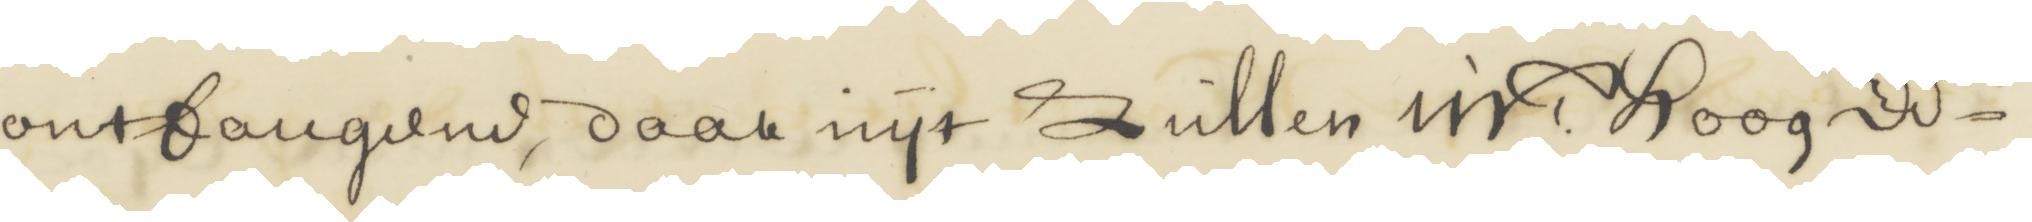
ontfangene, daar uijt zullen UE: Hoog Ed=ns
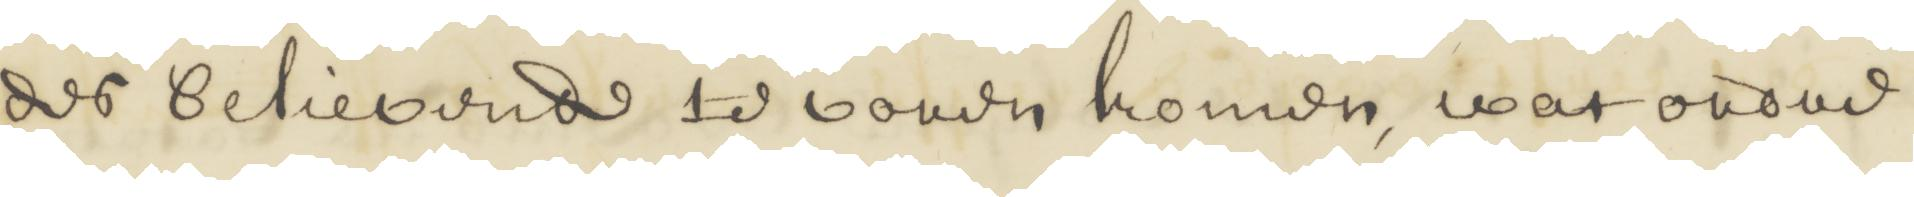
des believende te voren komen, wat ordre
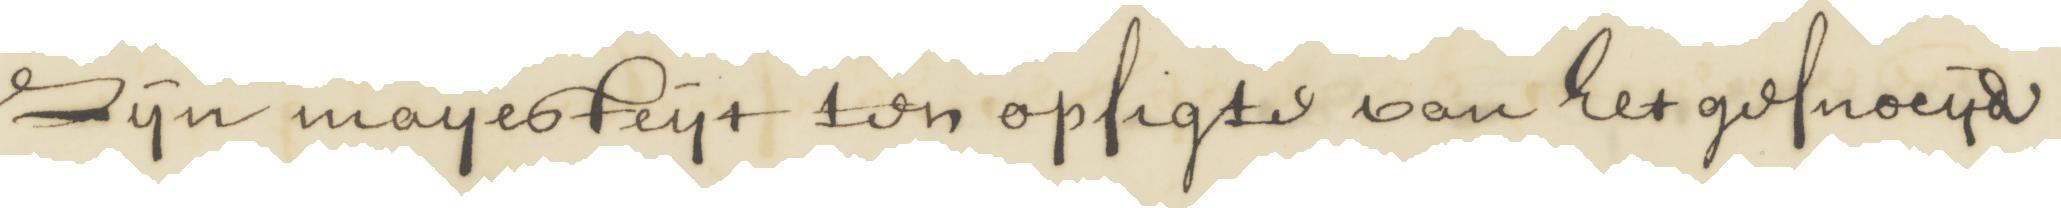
zijn maijesteijt ten opsigte van het gesnoeijde
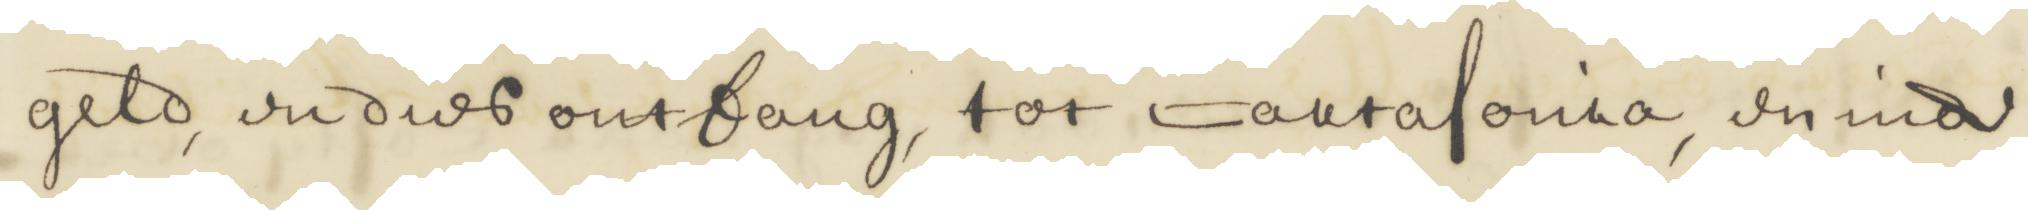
geld, en dies ontfang, tot cartasoura, en inde
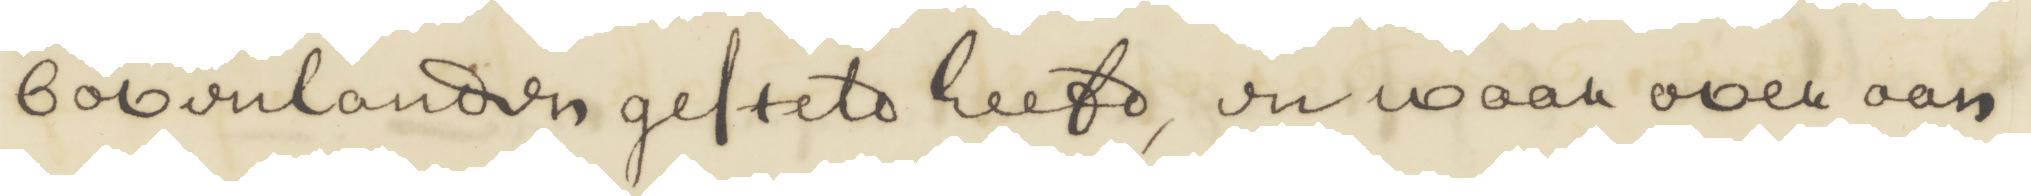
bovenlanden gesteld heefd, en waar over aan
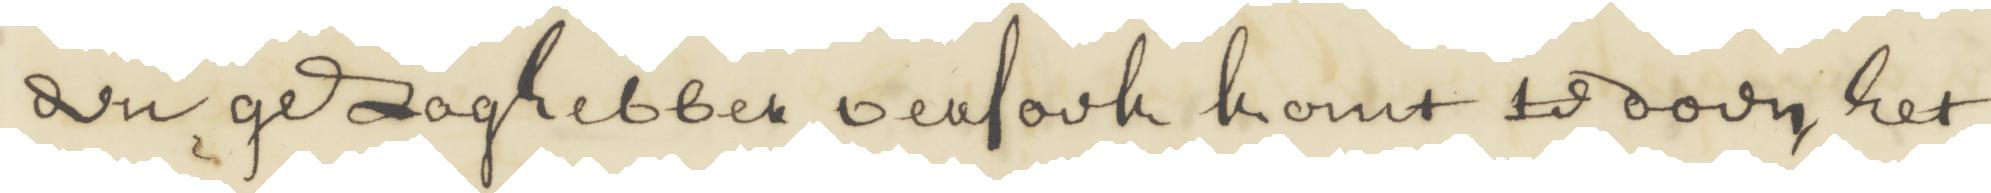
den gezaghebber versoek komt te doen, het
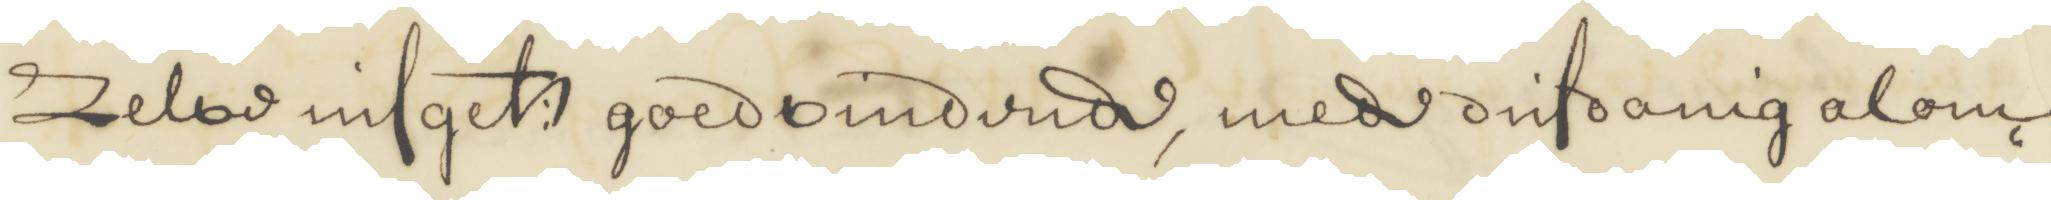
zelve insgelijk: goed vindende, mede dusdanig alom„
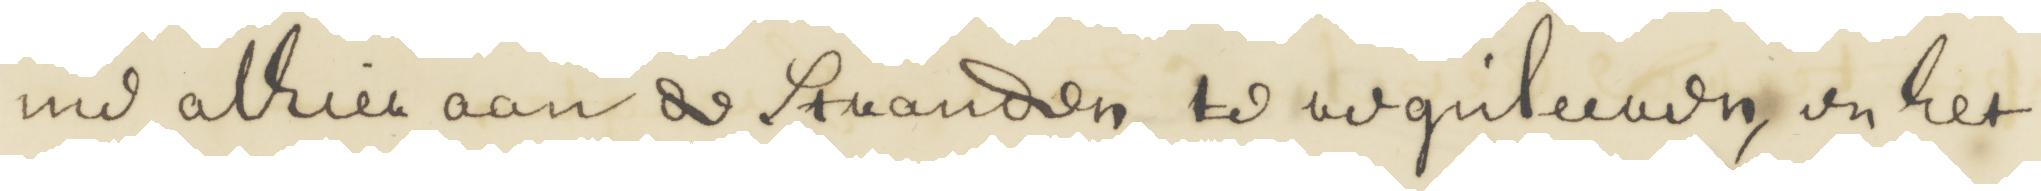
me alhier aan de stranden te reguleeren, en het
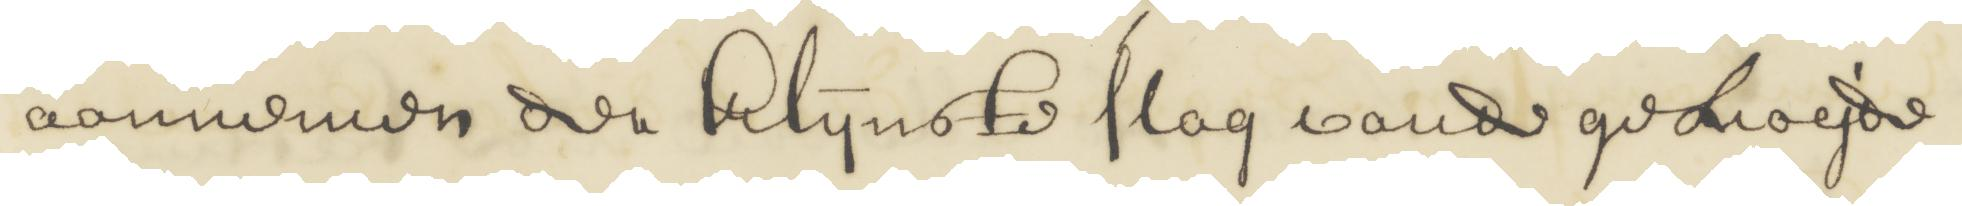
aannemen der klijnste slag vande gesnoejde
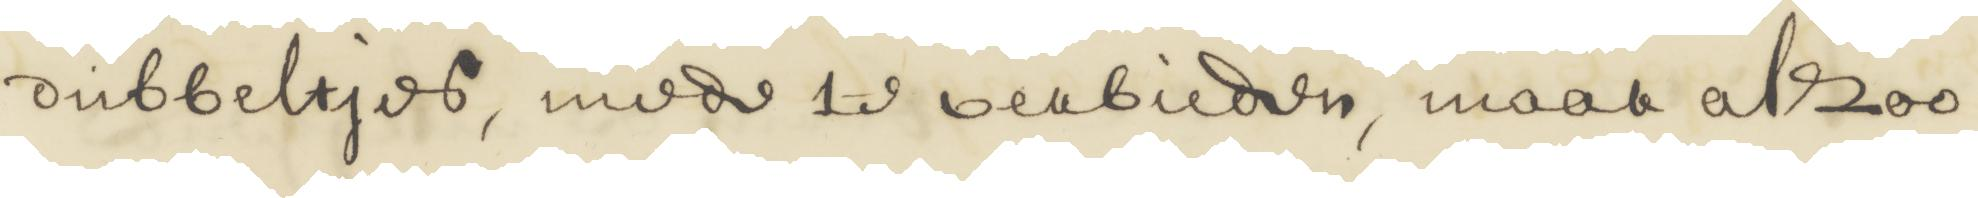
dubbeltjes, mede te verbieden, maar alzoo
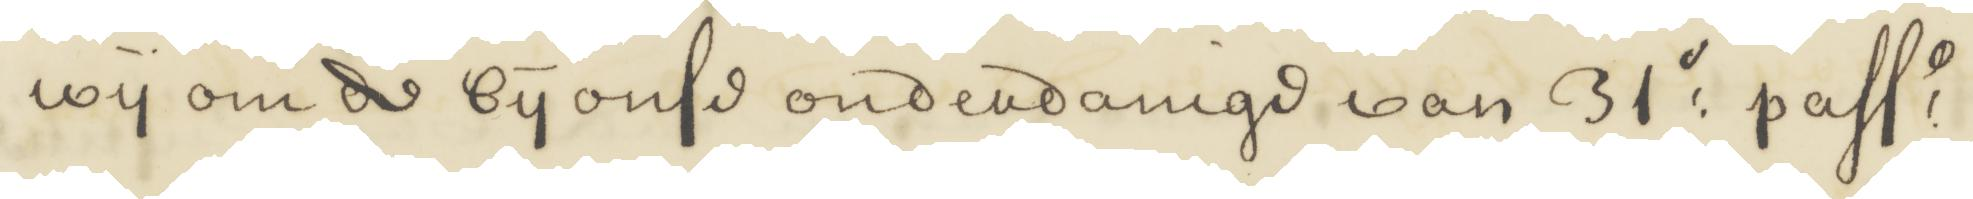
wij om de bij onse onderdanige van 31:e pass:o
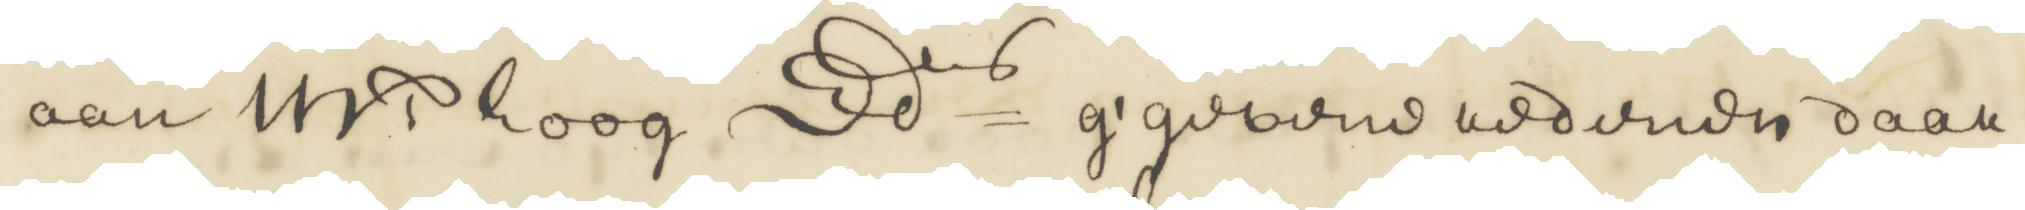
aan UE: hoog Ed=ns g’gevene redenen daar
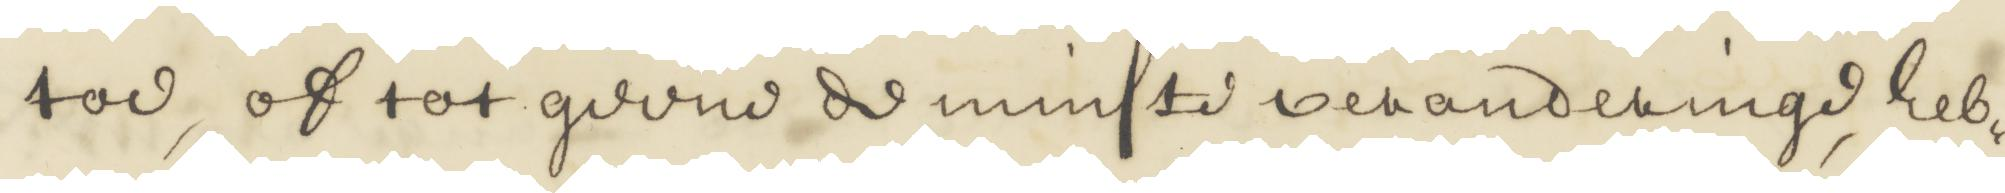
toe, of tot geene de minste veranderinge heb„
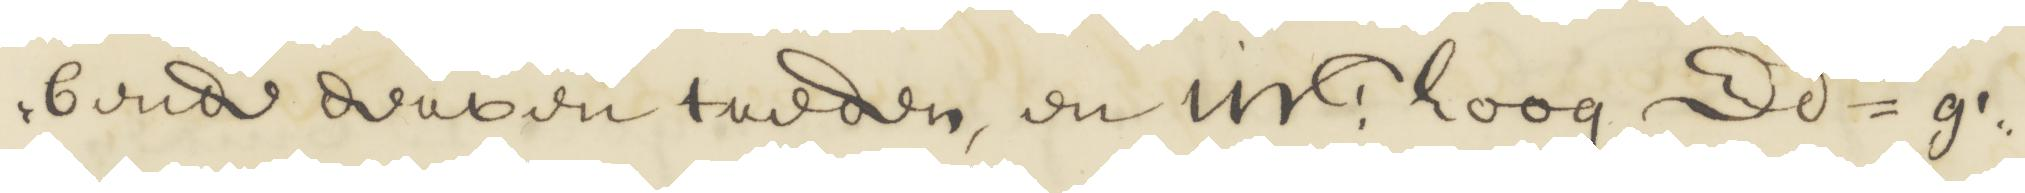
„bende derven treden, en UE: hoog Ed=ns g'„
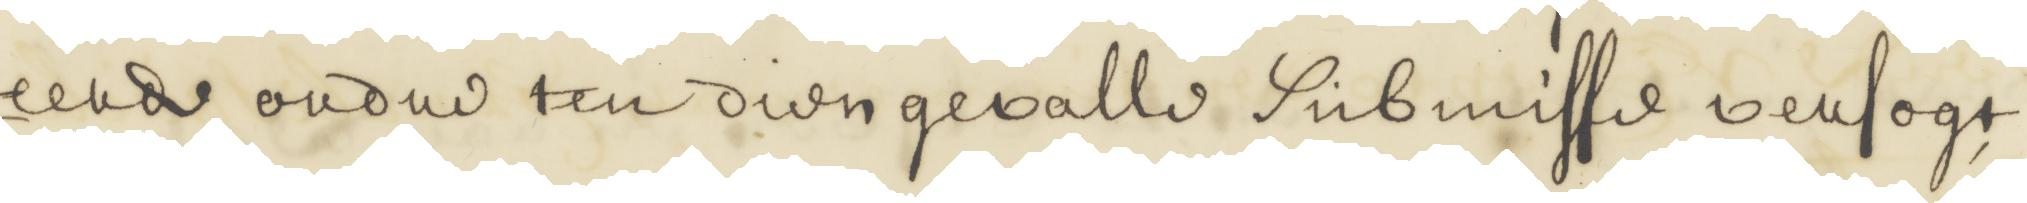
eerde ordre ten dien gevalle submisse versogt,
